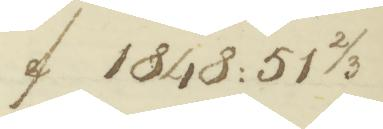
ƒ 1848:51 2/3
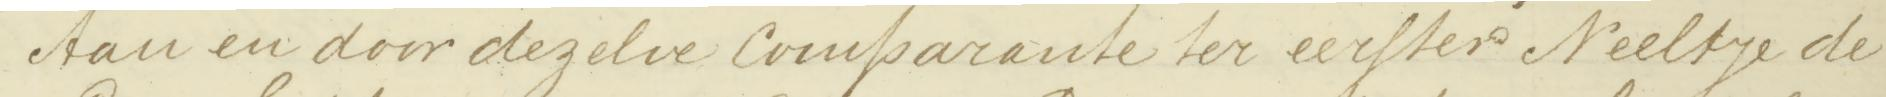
Aan en door dezelve comparante ter eerster Neeltje de
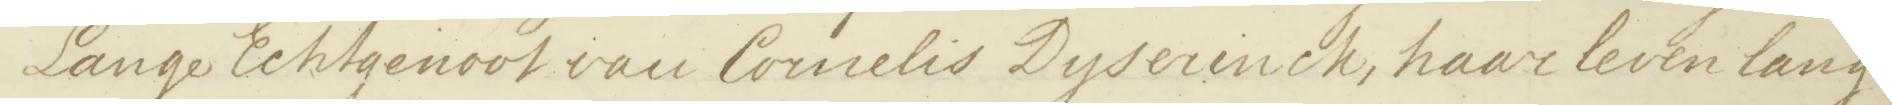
Lange Echtgenoot van Cornelis Dysterinck, haar leven lang
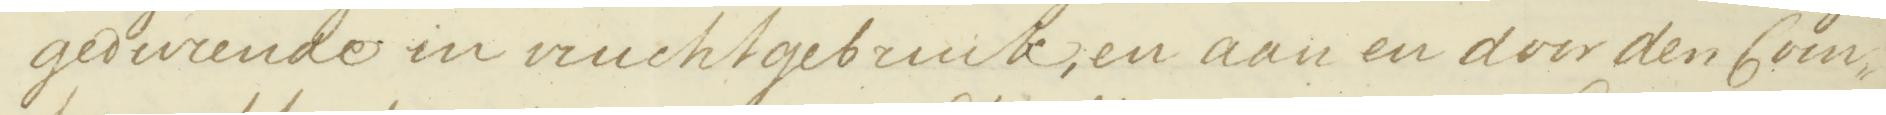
gedurende in vruchtgebruik, en aan en door den Com„
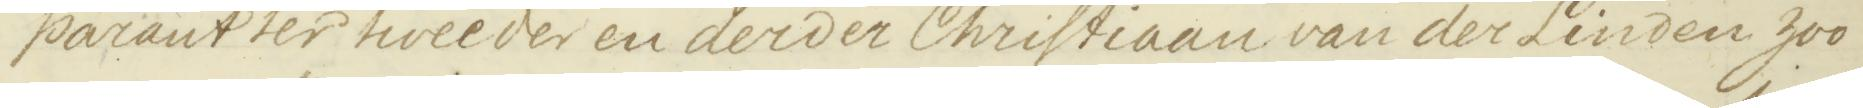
parant ter tweeder en derder Christiaan van der Linden zoo
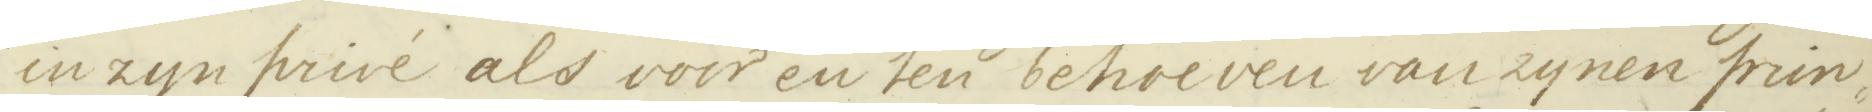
in zijn privé als voor en ten behoeven van zijnen prin„
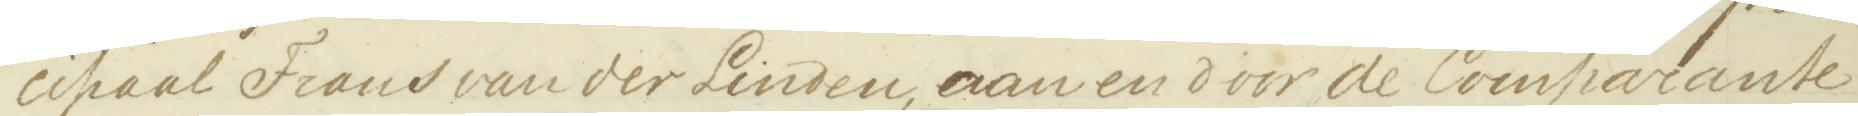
cipaal Frans van der Linden, aan en door de Comparante
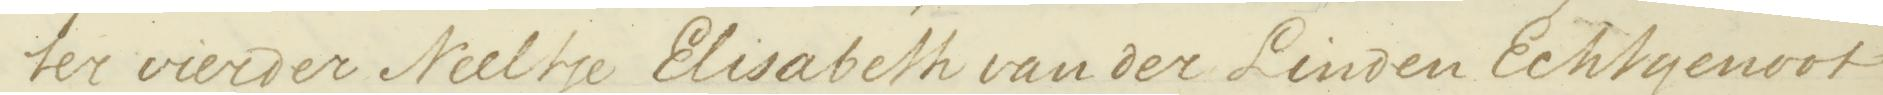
ter vierder Neeltje Elisabeth van der Linden Echtgenoot
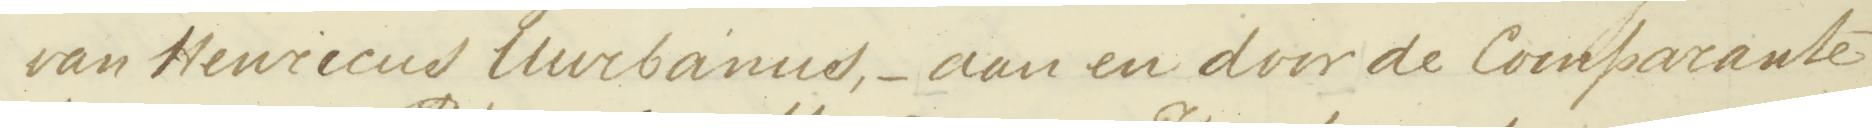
van Henricus Uurbanus, - aan en door de Comparante
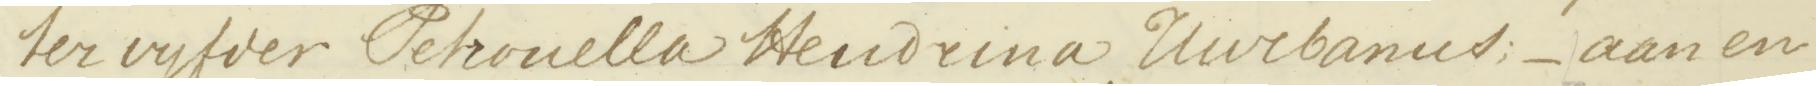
ter vijfder Petronella Hendrina Uurbanus: - aan en
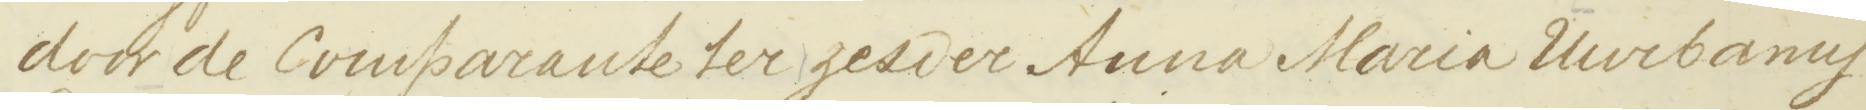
door de Comparante ter zesder Anna Maria Uurbanus
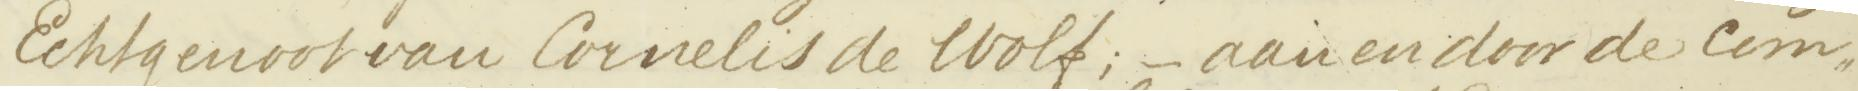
Echtgenoot van Cornelis de Wolf; - aan en door de com„
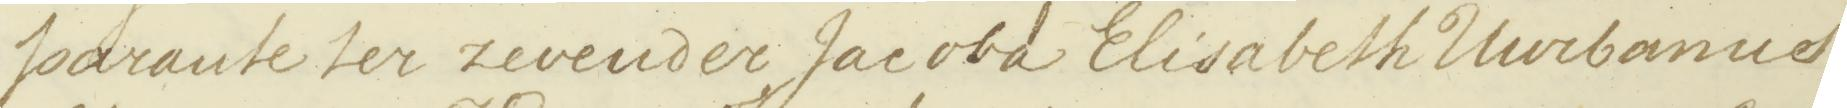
parante ter zevender Jacoba Elisabeth Uurbanus
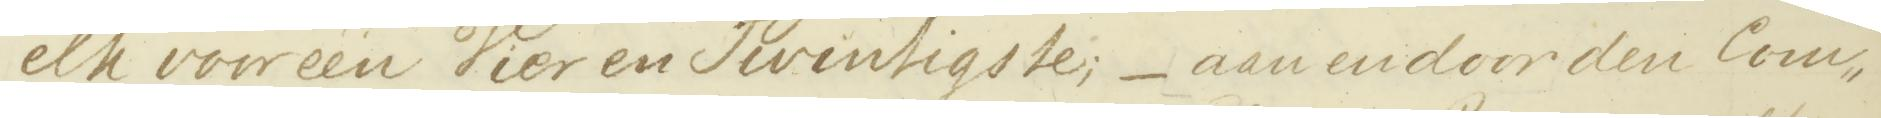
elk voor één Vier en Twintigste; -aan en door den Com„
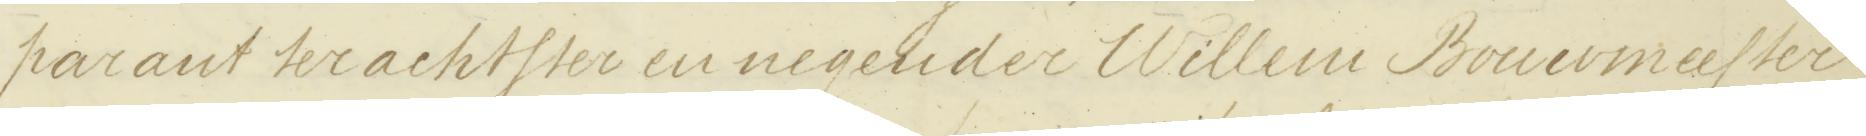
parant ter achtster en negender Willem Bouwmeester
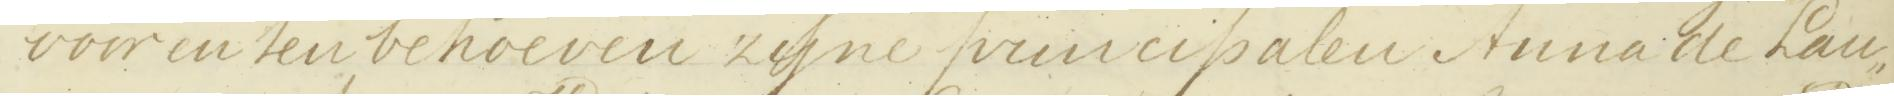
voor en ten behoeven zyne principalen Anna de Lan„
